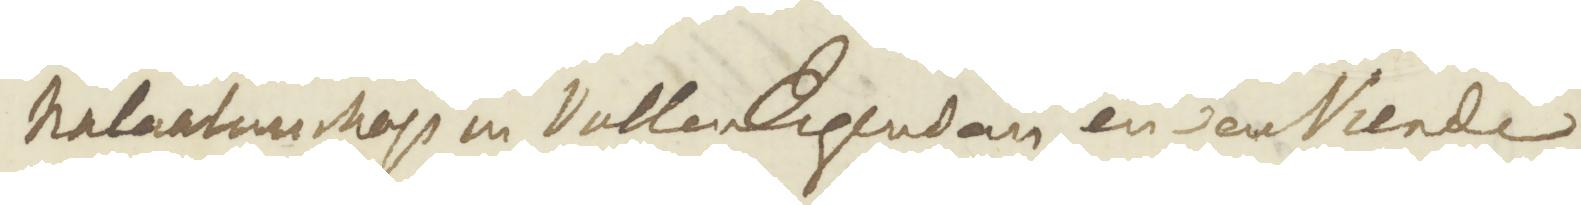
nalaatenschap in vollen Eigendom, en een vierde
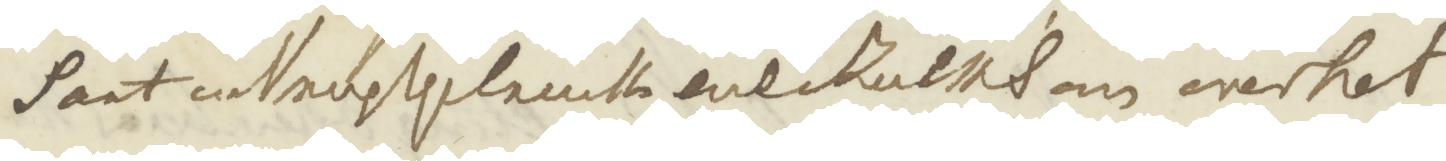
Part en Vrugtgebruik, ende zulks om over het
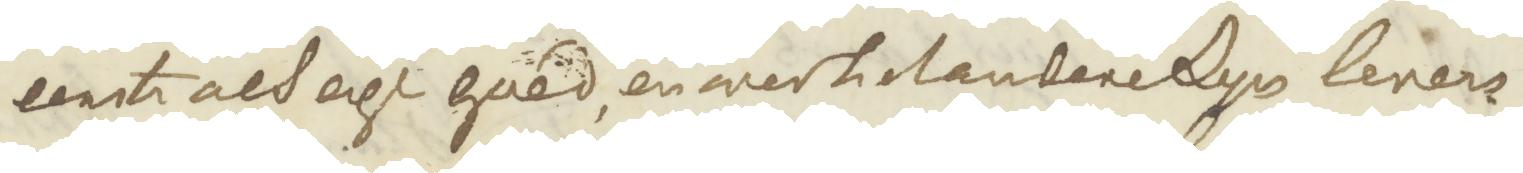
eerste als agt goed en over het andere zyn levens„
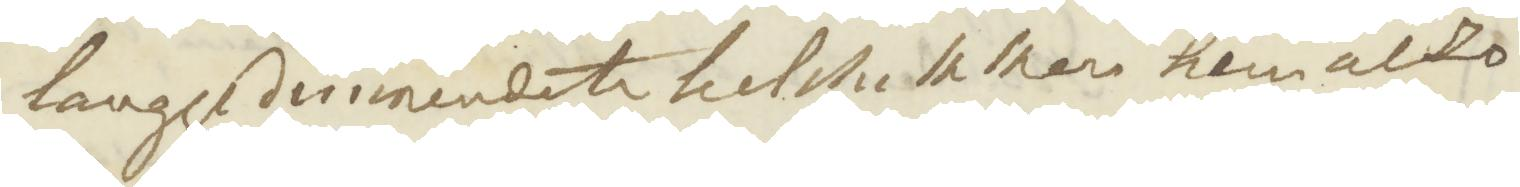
langen dienende te tesstukken hem alzo
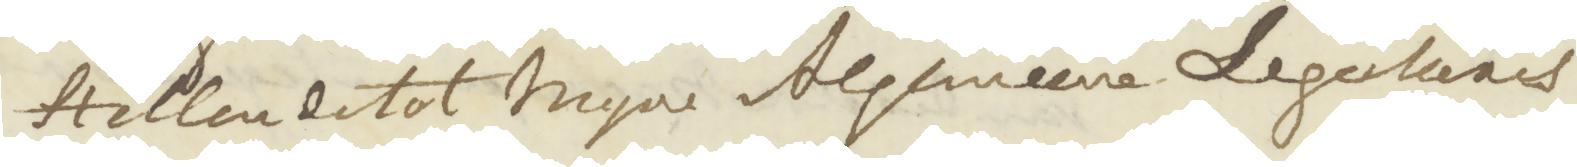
stellende tot myne Algemeene secretaris
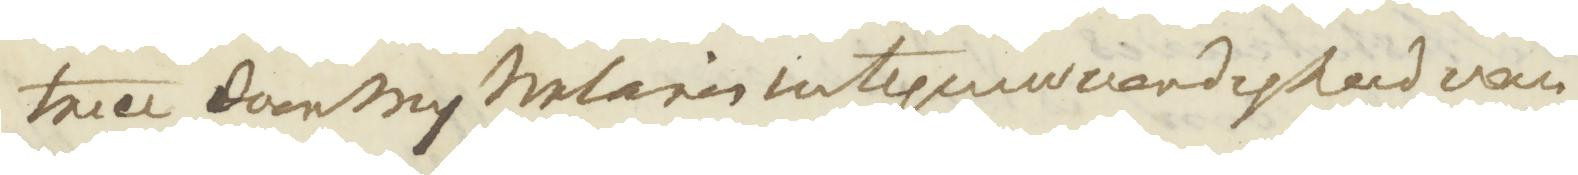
trice door my Notaris in tegenwoordigheid van
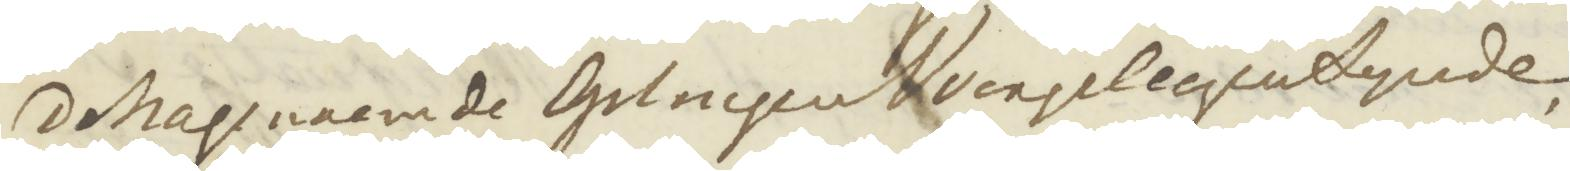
de Nagenoemde Getuigen Voorgelegen zynde,
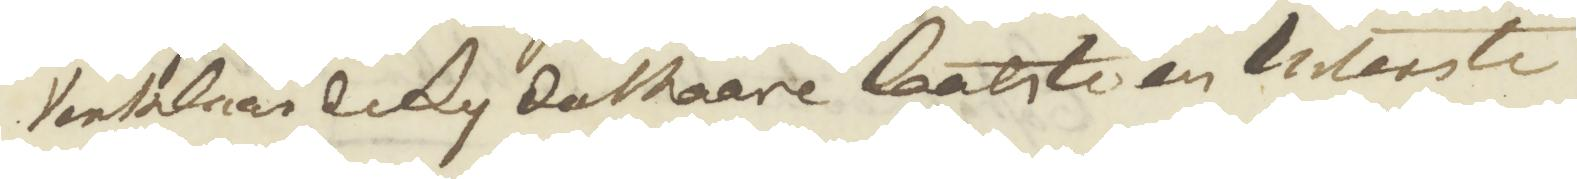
Verklaarde zy dat haare laatste en Uiterste
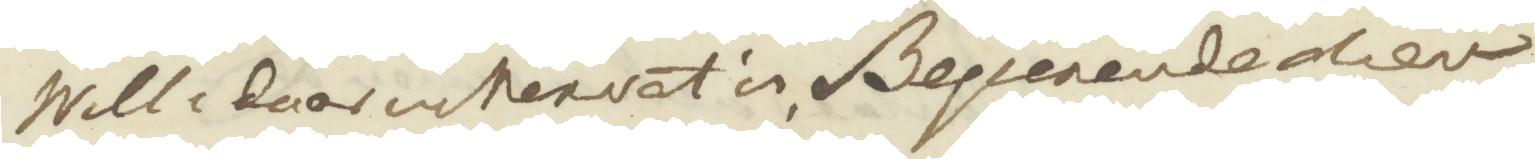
wille daar in vervat is, Begeerende dien
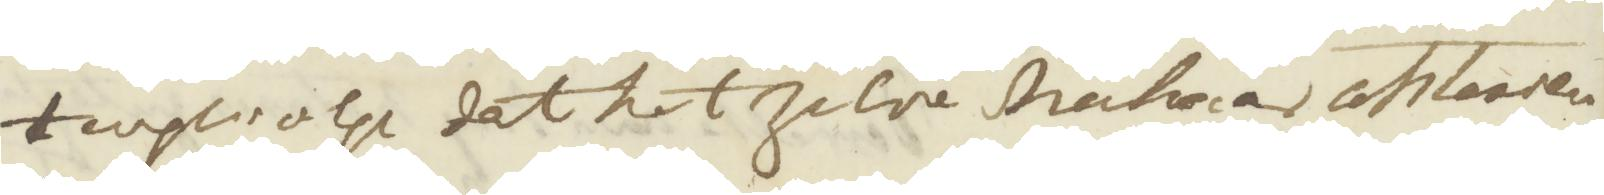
ten gevolge dat het zelve na haar afsterven
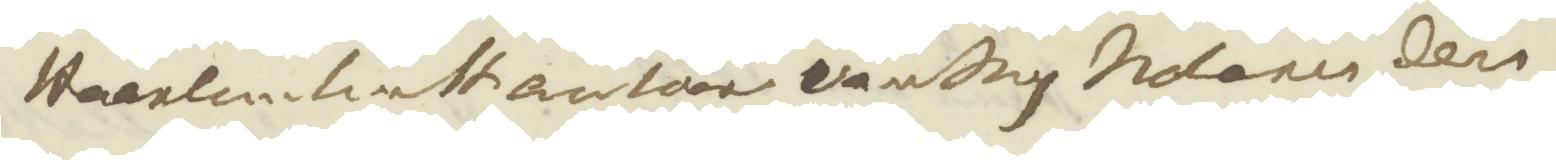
Haarlem ten kantoor van my notaris den
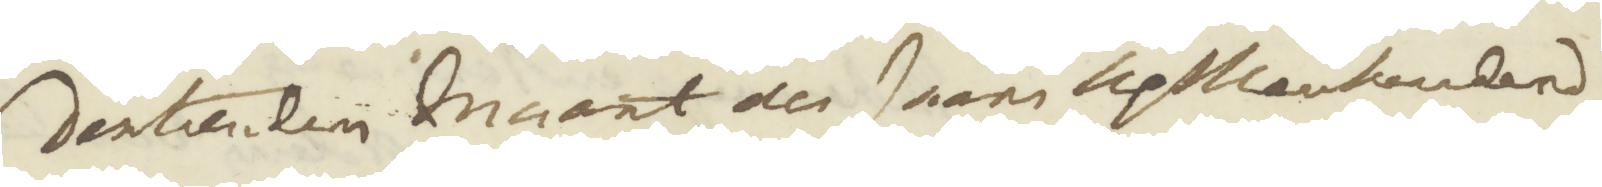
dertienden maart des Jaars agttienhonderd
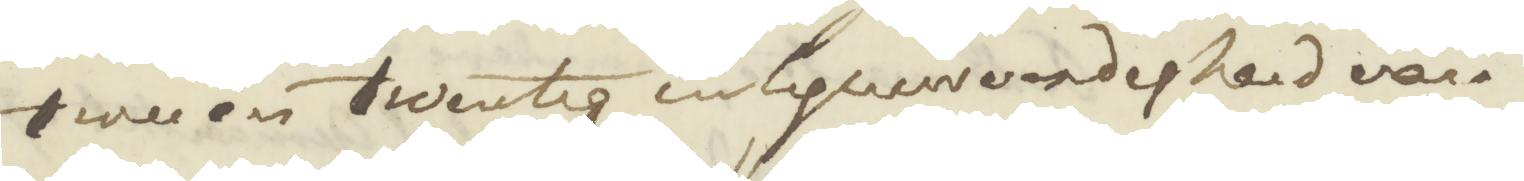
twee en twintig, in tegenwoordigheid van
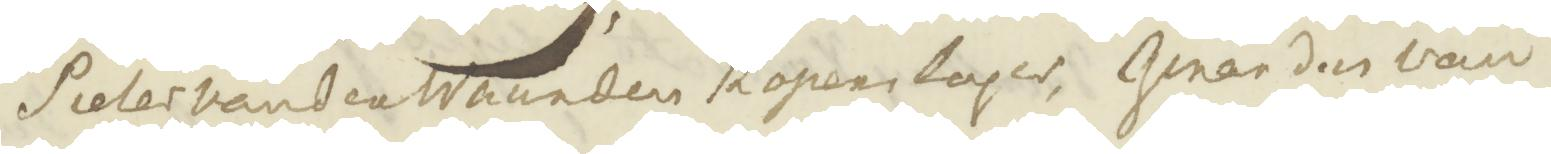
Pieter van den Waarden koperslager, Gererdus van
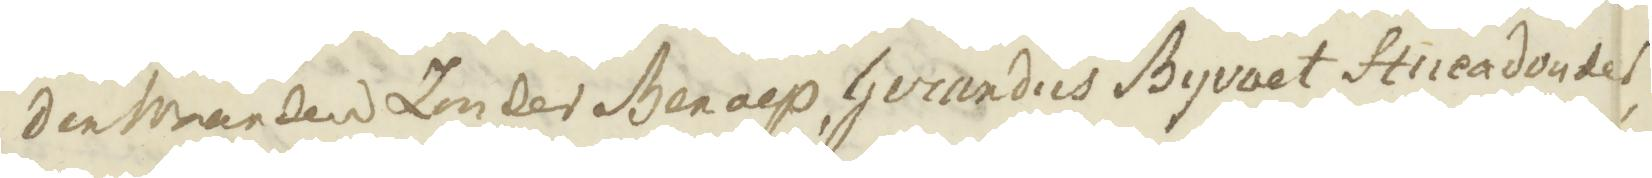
der waarden zonder Beroep, Gerardus Byvoet Stucadorder,
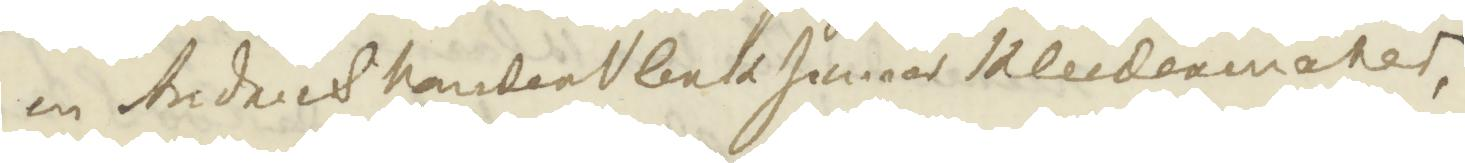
en Andries van der Vlerk Junior Kleedermaker,
